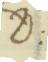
9: 8
